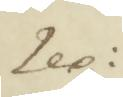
reg: ½
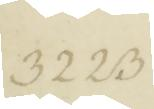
3223
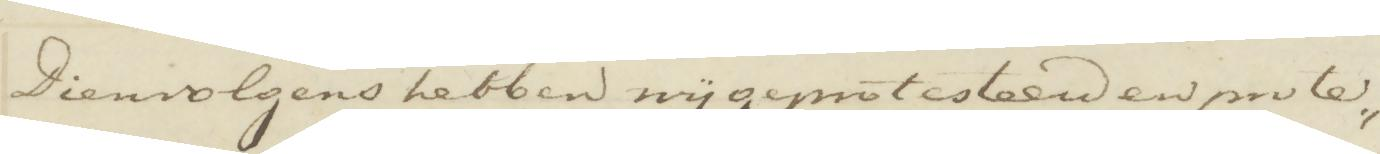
Dienvolgens hebben wij geprotesteerd en prote„
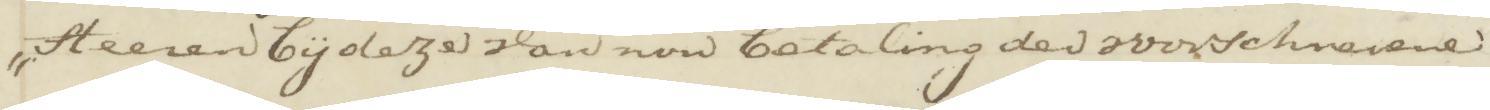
„steeren bij deze van non betaling der voorschrevene
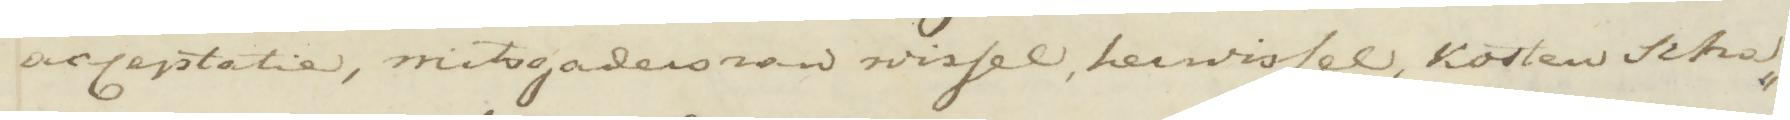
acceptatie, mitsgaders van wissel, herwissel, kosten scha„
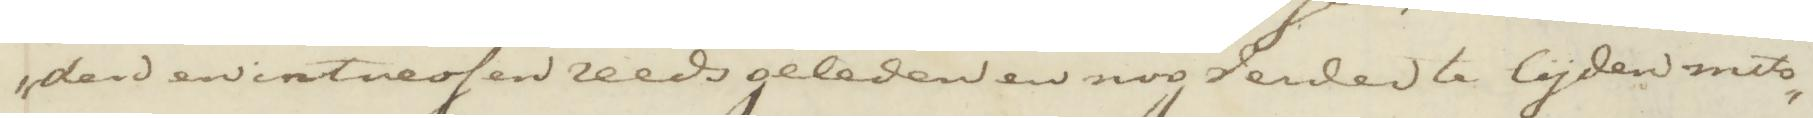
„den en intressen reeds geleden en nog Verder te lijden mits„
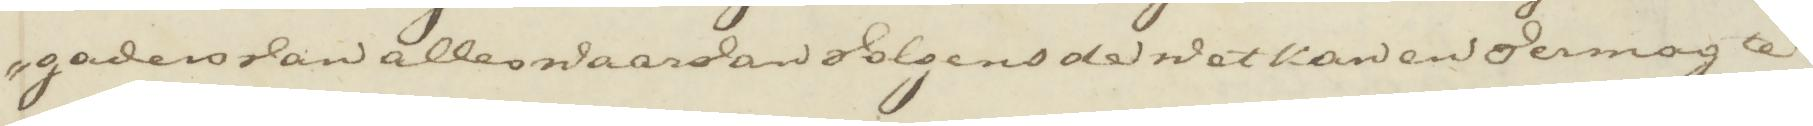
„gaders van alles waarvan volgens de wet kan en vermag te
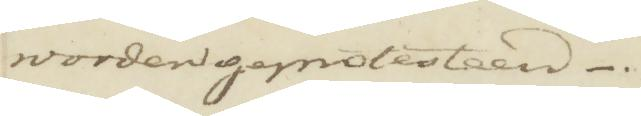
worden geprotesteed – .
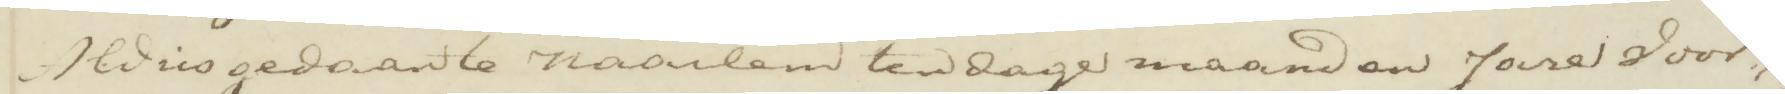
Aldus gedaan te Haarlem ten dage maand en Jare Voor„
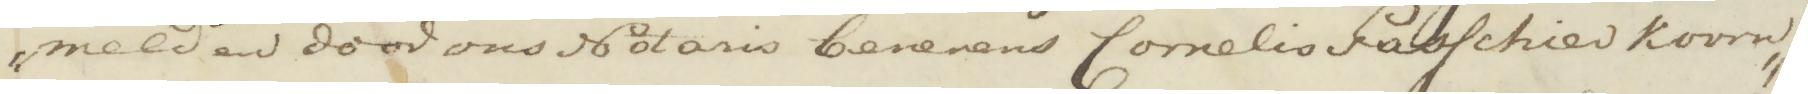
„meld en door ons Notaris benevens Cornelis Passchier koorn„
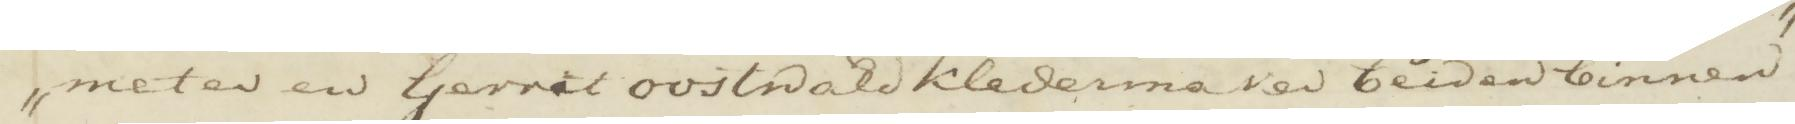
„meter en Gerrit oostwald kledermaker beiden binnen
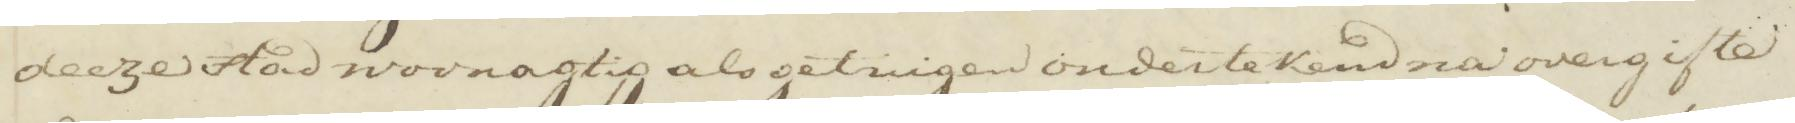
deeze stad woonagtig als getuigen ondertekend na overgifte
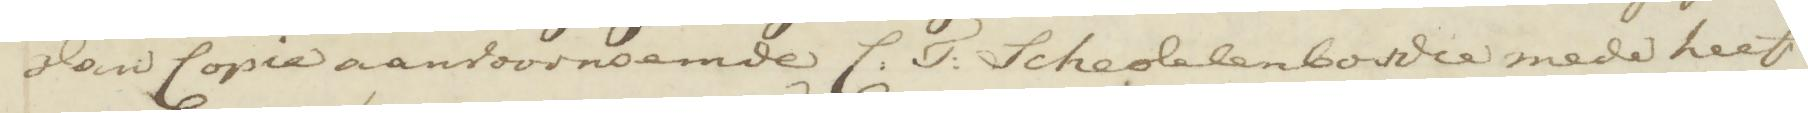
Van Copie aanvoornoemde C: T: Scheedelenbos die mede heeft
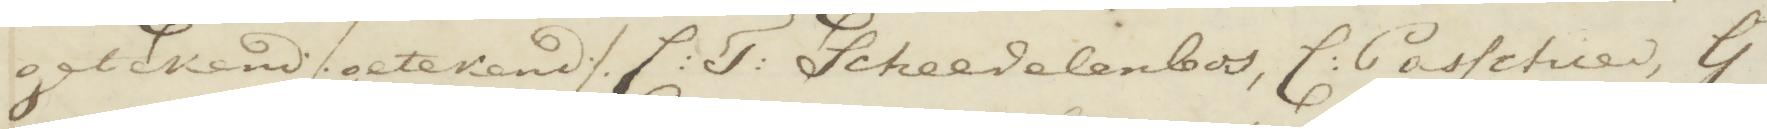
getekend ./.getekend ./. C: T: Scheedelenbos, C: Passchier, G:t
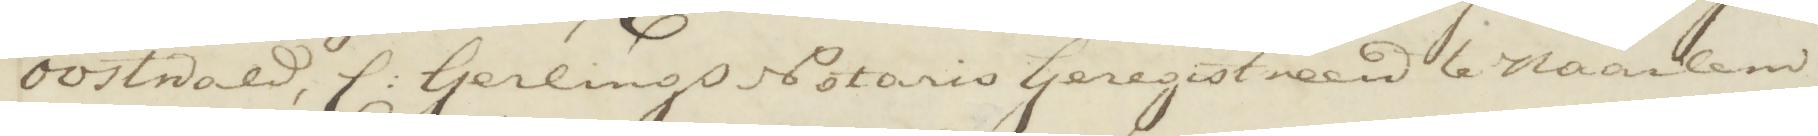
oostwald, C: Gerlings Notaris Geregistreerd te Haarlem
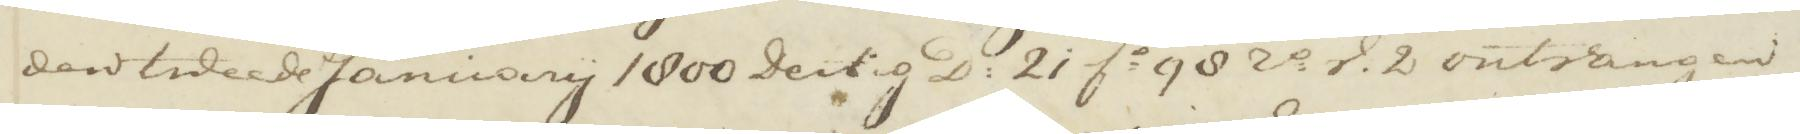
den twee Januarij 1800 Dertig D: 21 f=o 98 r=o V. 2 ontvangen
